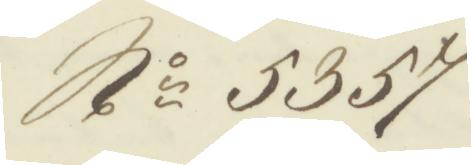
N=o 5357
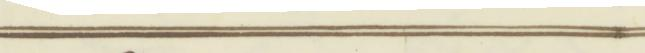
Nationale Militie.-
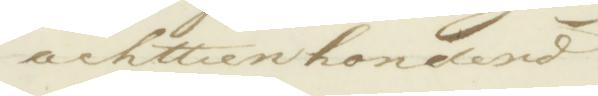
achttienhonderd
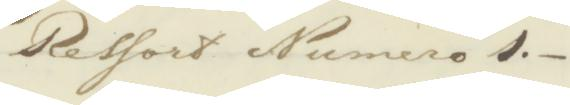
Ressort Numero 1.—
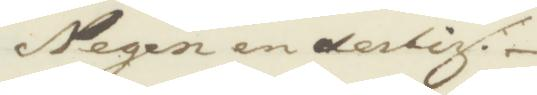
Negen en dertig.-
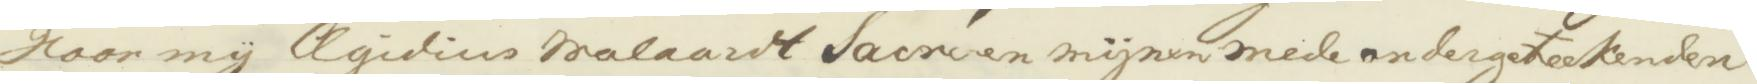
Voor mij Aegidius Walaardt Sacré en mijnen mede ondergeteekenden
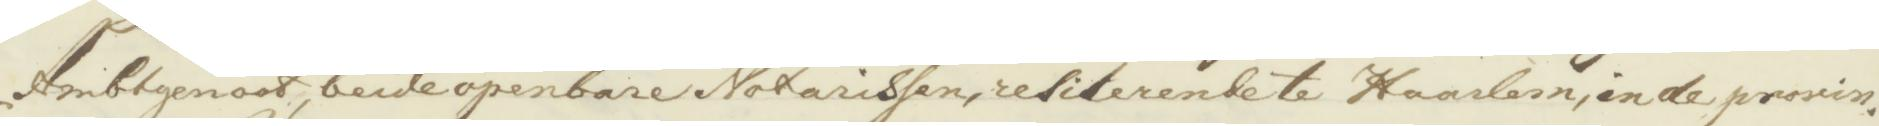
Ambtgenoot, beide openbare Notarissen, residerende te Haarlem, in de provin„
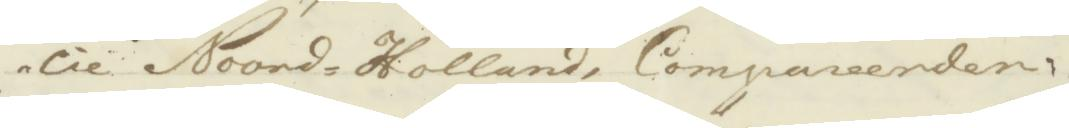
„cie: Noord-Holland, Compareerden:
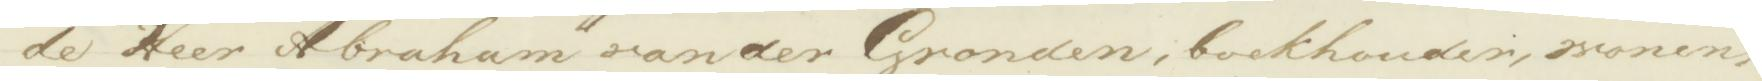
de Heer Abraham van der Gronden, boekhouder, wonen,
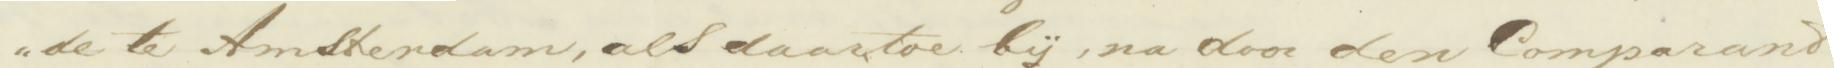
„de te Amsterdam, als daartoe bij, na door den Comparant
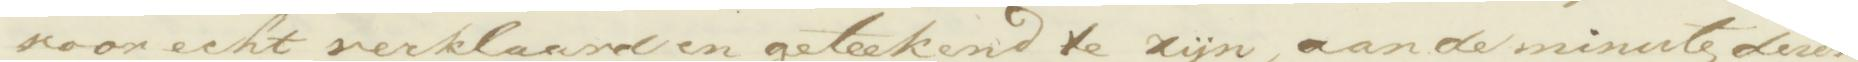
voor echt verklaard en geteekend te zijn, aan de minute deser
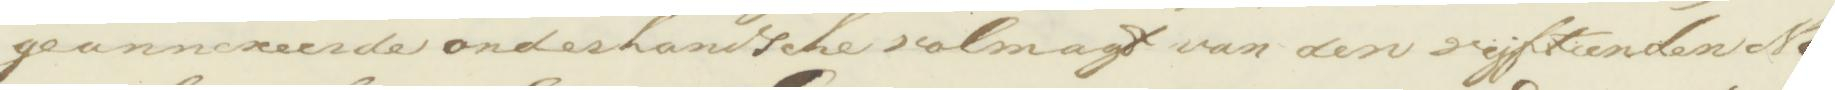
geannexeerde onderhandsche volmagt van den vijftienden No„
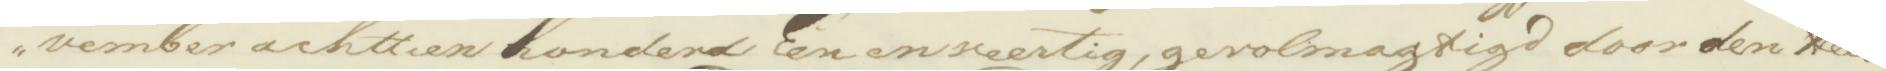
„vember achttien honderd Een en veertig, gevolmagtigd door den Heer
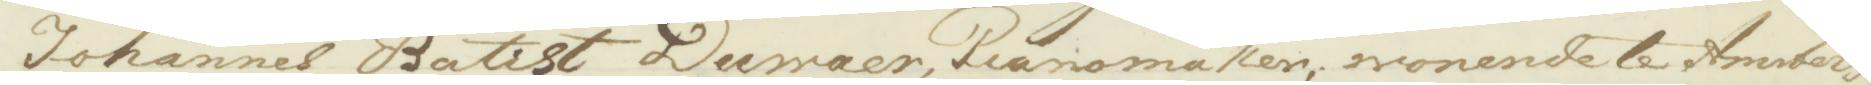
Johannes Batist Duwaer, Pianomaker, wonende te Amster
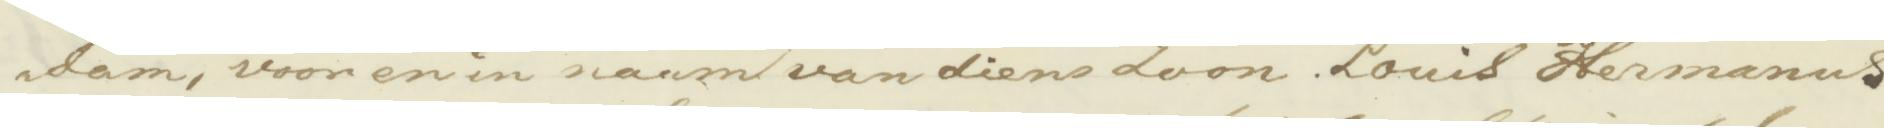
„dam, voor en in naam van diens zoon Louis Hermanus
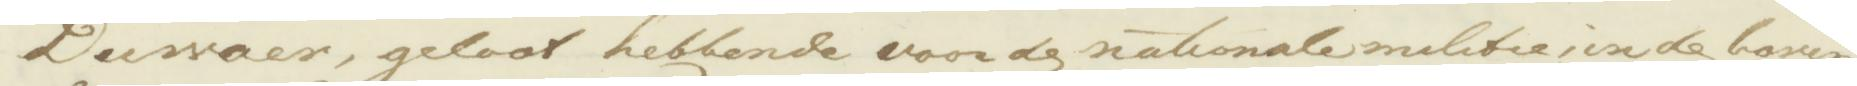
Duwaer, geloot hebbende voor de nationale militie, in de boven
